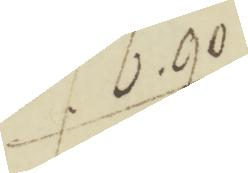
f 6.90
